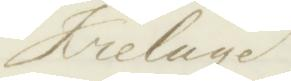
Krelage
